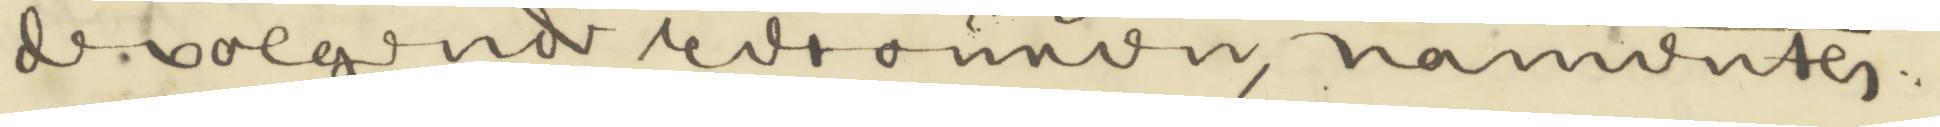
de volgende retouren, namentlijk:
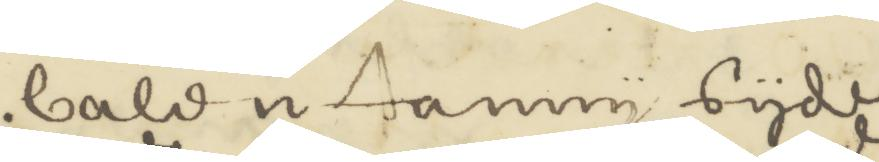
573. balen tannij sijde
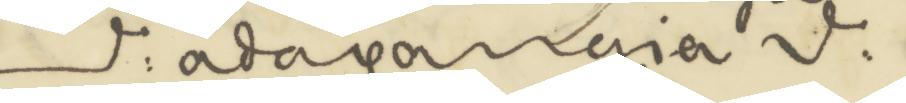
227. _:o adapangia d:o
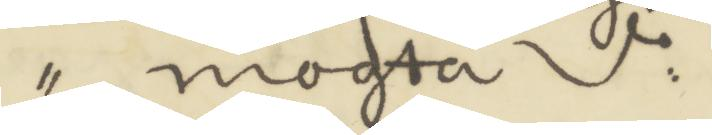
115. „ mogta d:o
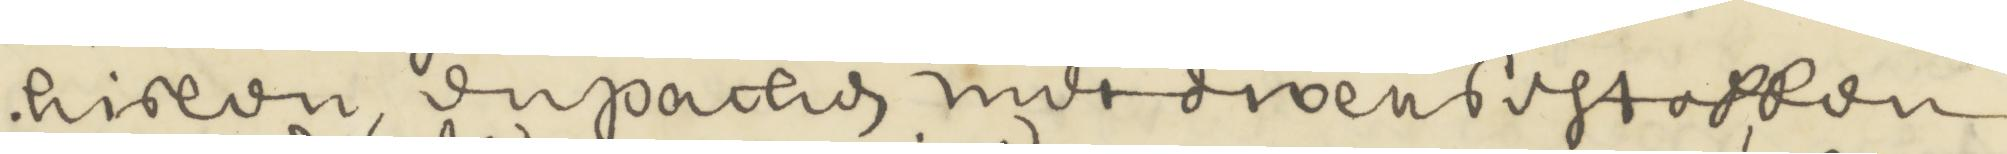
200. kisten, en packen met diverse stoffen
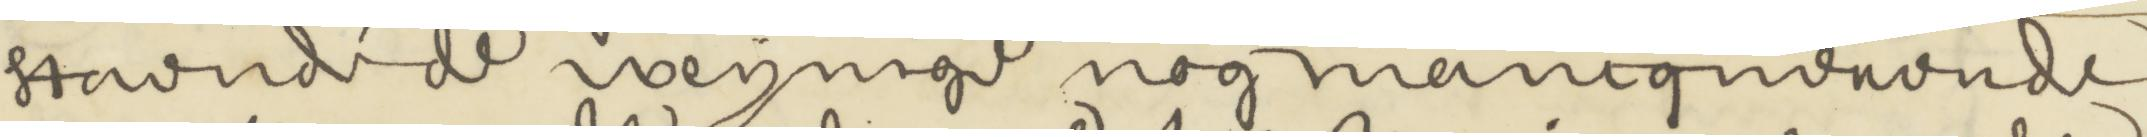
staende de weijnige nog mancquerende
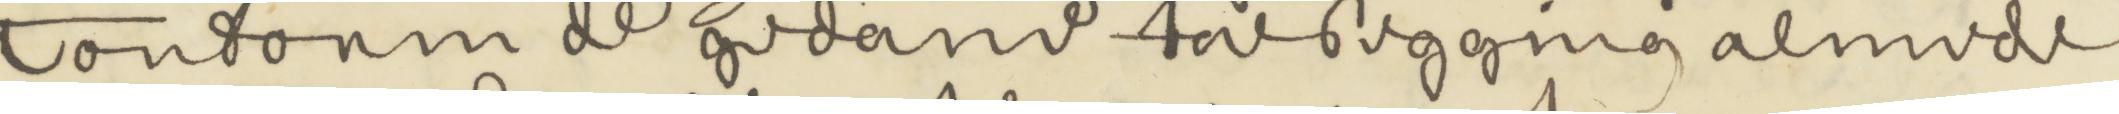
Conform de gedane toesegging almede
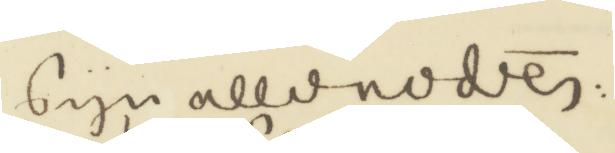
sijn alle redelijk:
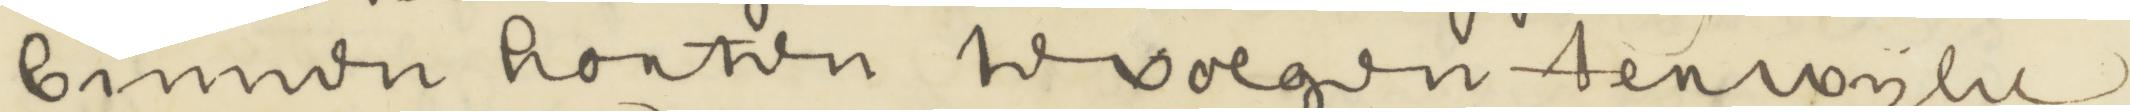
binnen korten te volgen terwijle
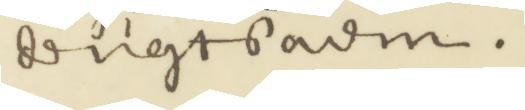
deugtsaem.
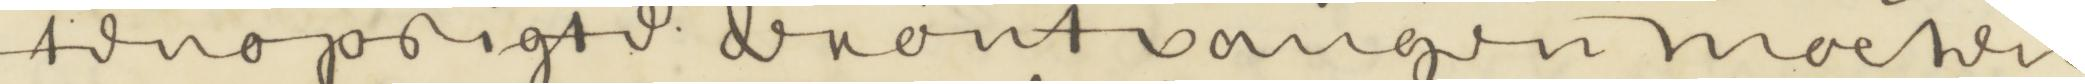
ten opsigte der ontvangen moeten
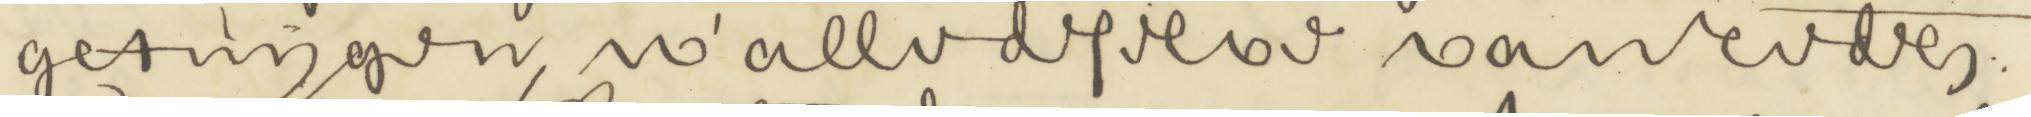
getuijgen w' alle deselve van redelijk:
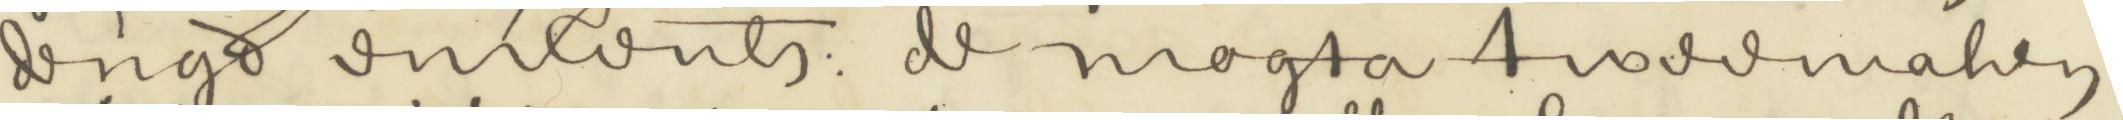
deugd en Eenlijk de mogta tweemalen
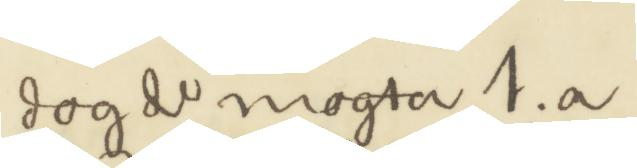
dog de mogta 1. a
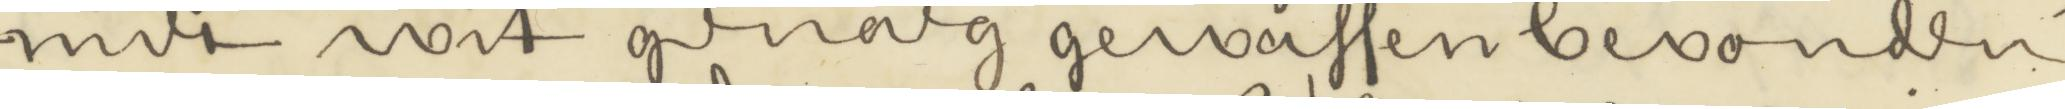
niet wit genoeg gewassen bevonden
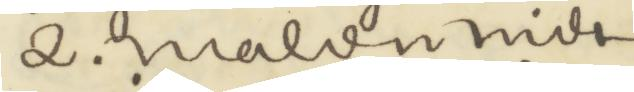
2. malen niet
